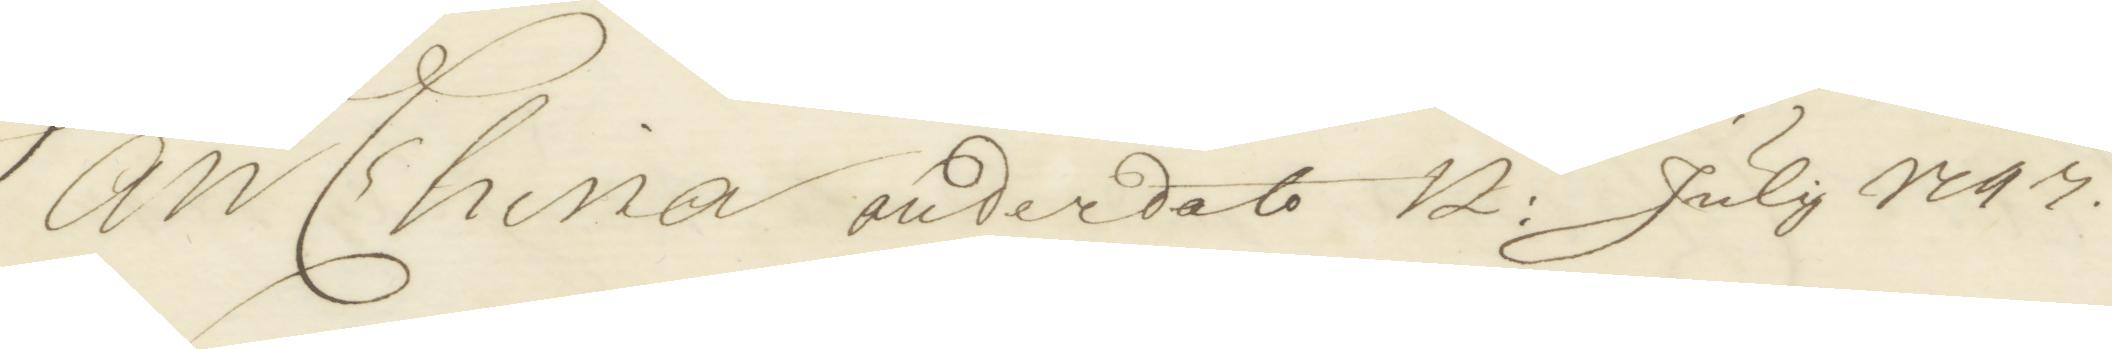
Van China onderdato 12:' Julij 1747.
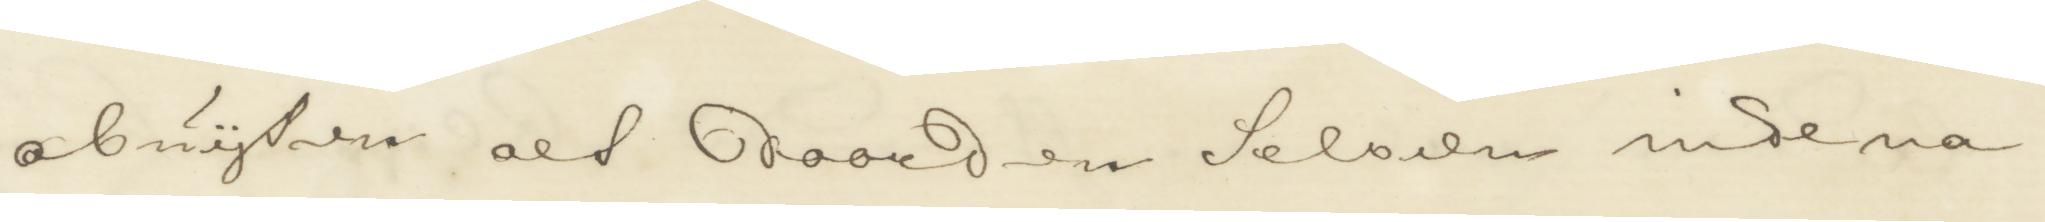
abuijsen als door den selven inde na
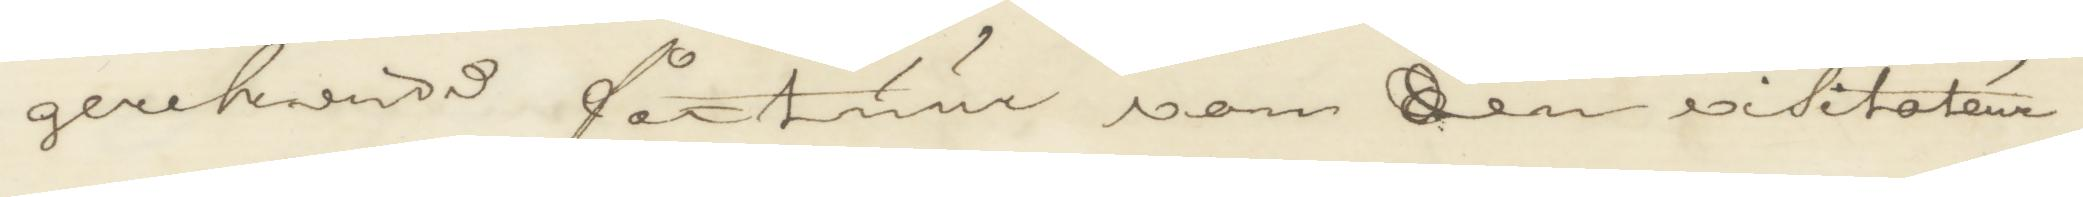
gerekende factuur van den visitateur
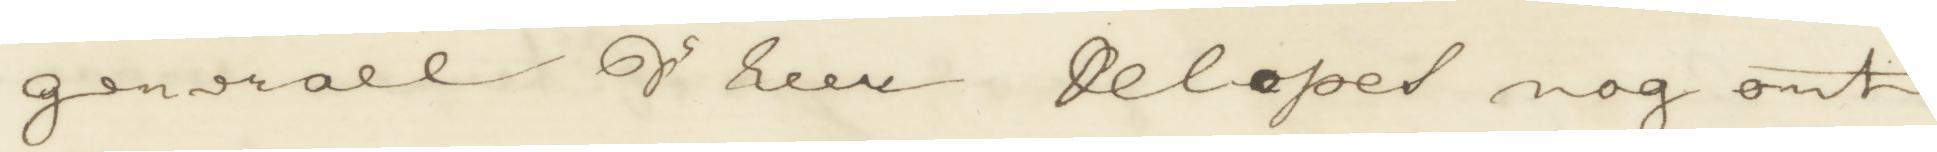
generael d’ heer delopes nog ont
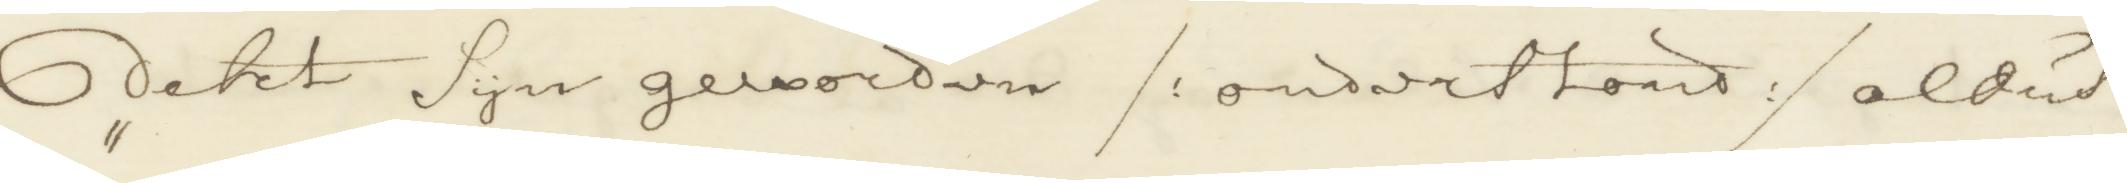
„dekt sijn geworden /: onderstond :/ aldus
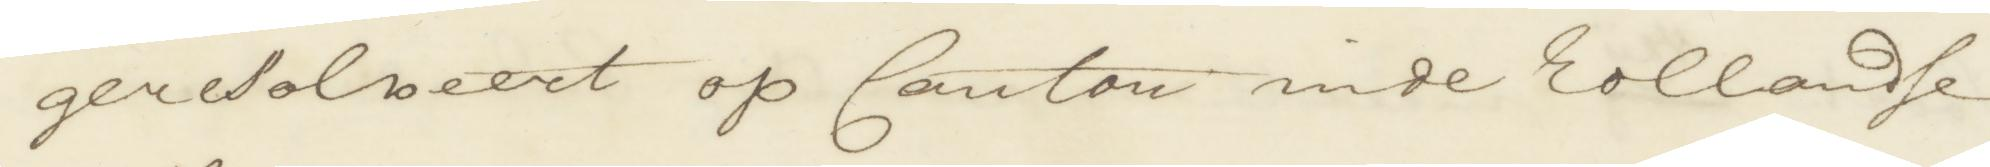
geresolveert op Canton in de hollandse
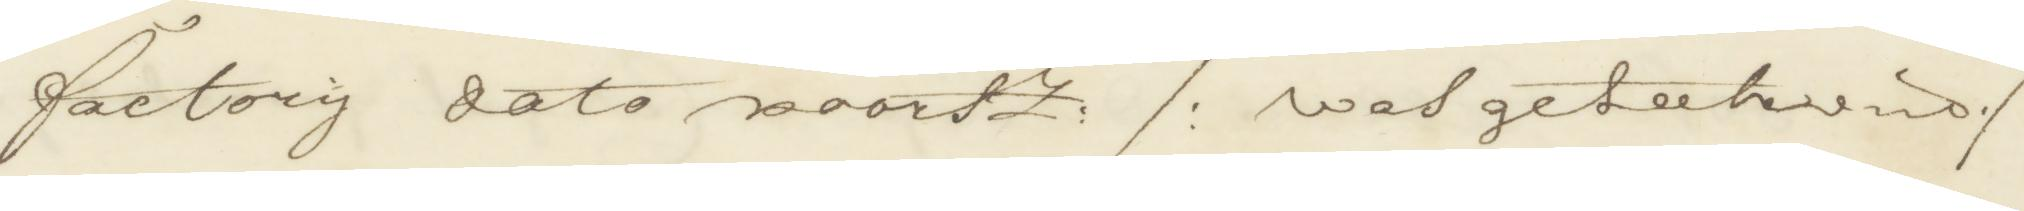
factorij dato voorsz: /: was geteekend ./
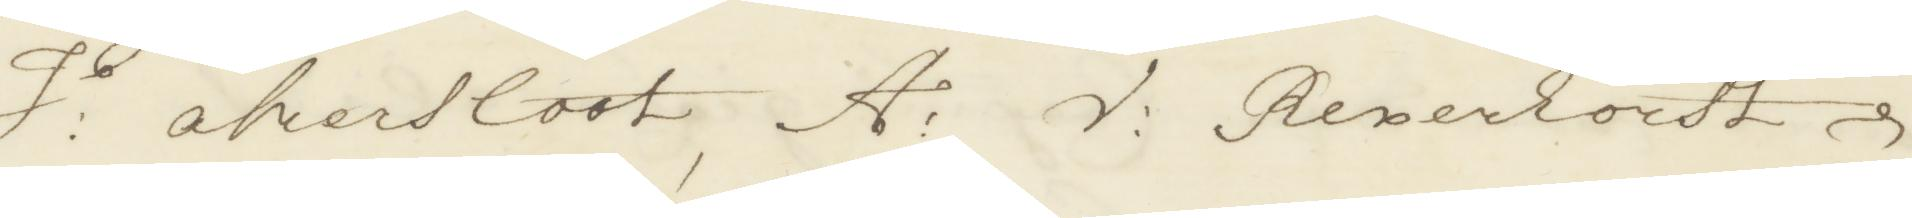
J:b akersloot, A: v: Reverhorst en
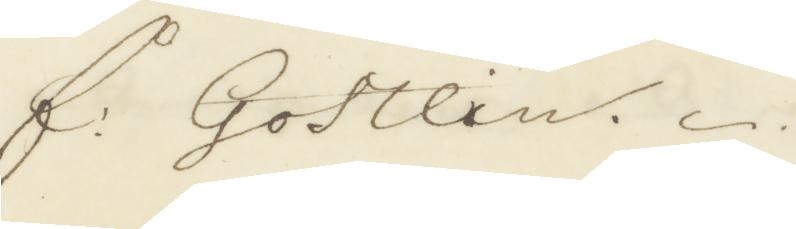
f: Gostlin.
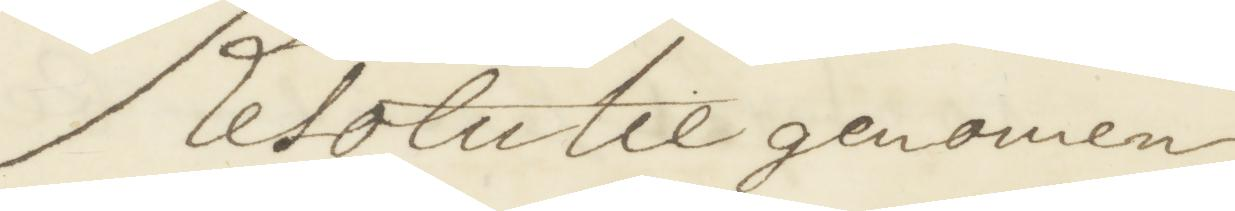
Resolutie genomen
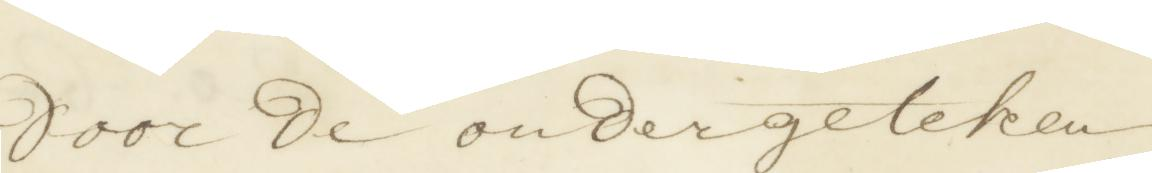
door de ondergeteken
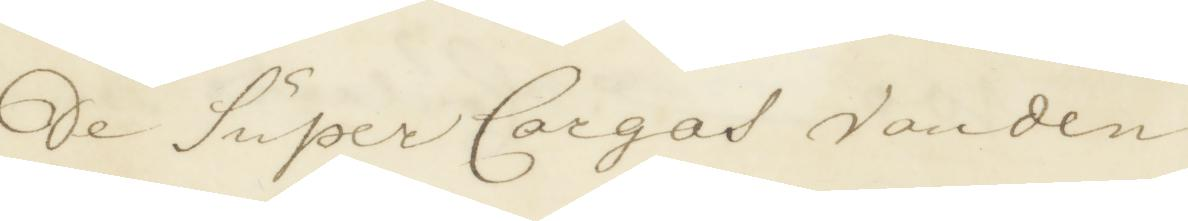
de super Cargas van den
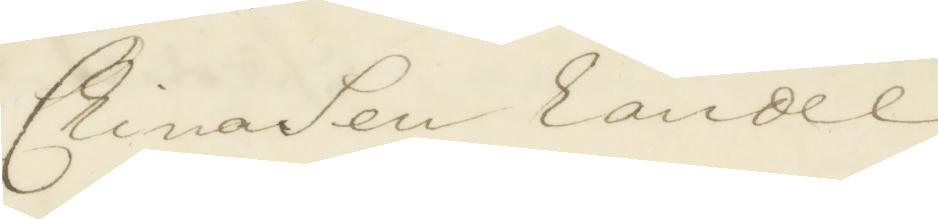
Chinasen handel
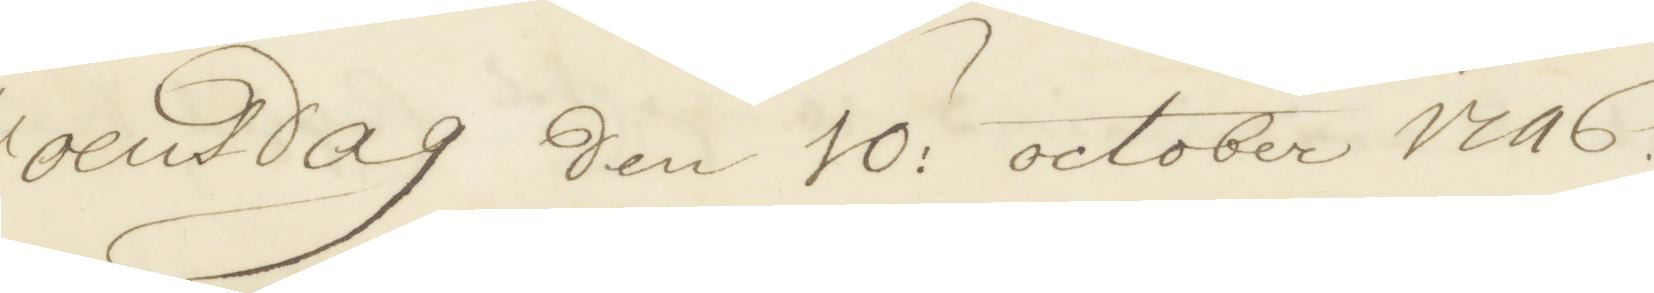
Woensdag den 10:' october 1746.
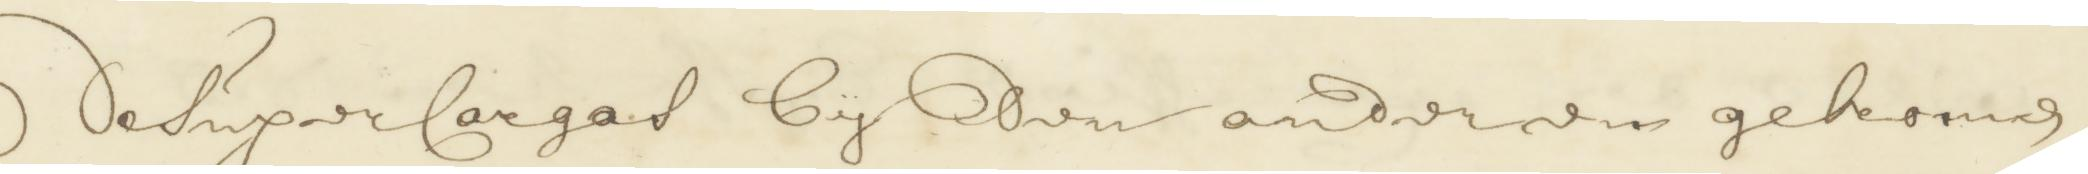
de supercargas bij den anderen gekomen
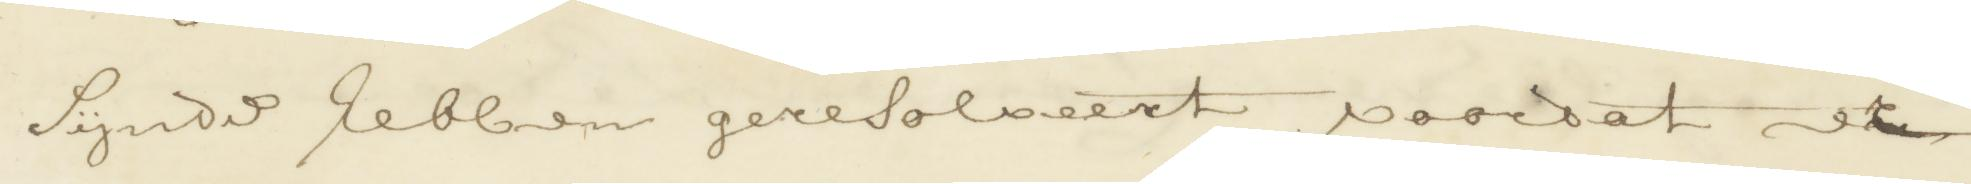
sijnde hebben geresolveert voordat er
